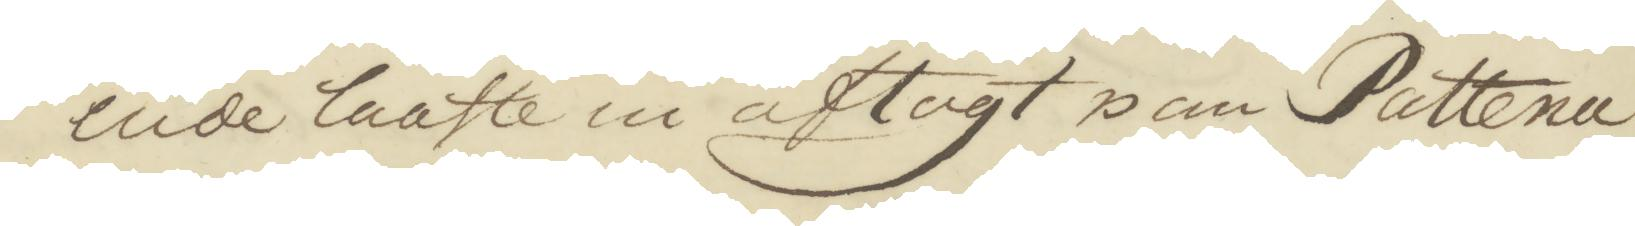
ende laaste in aftogt van Pattena
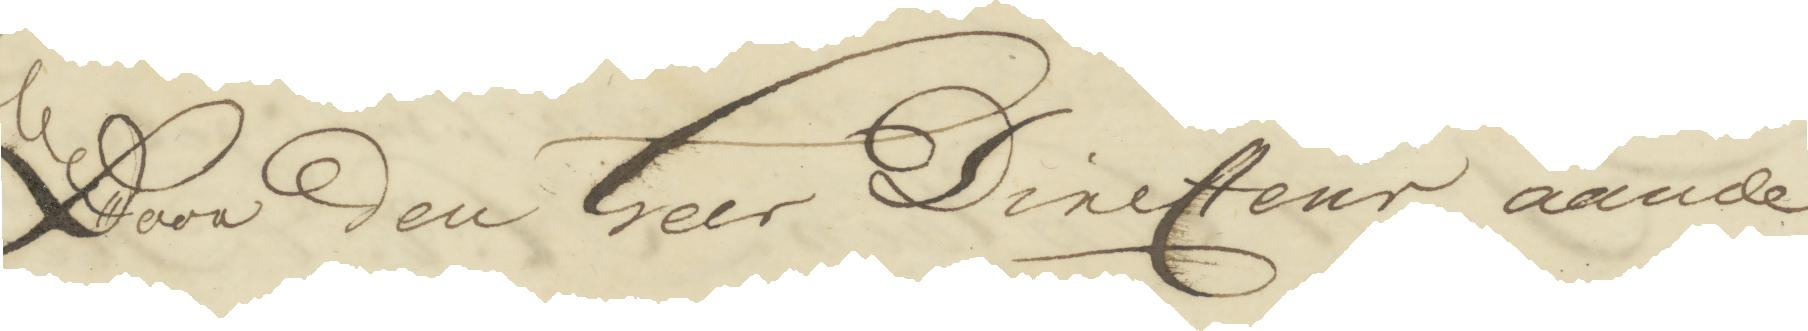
Door den heer Directeur aande
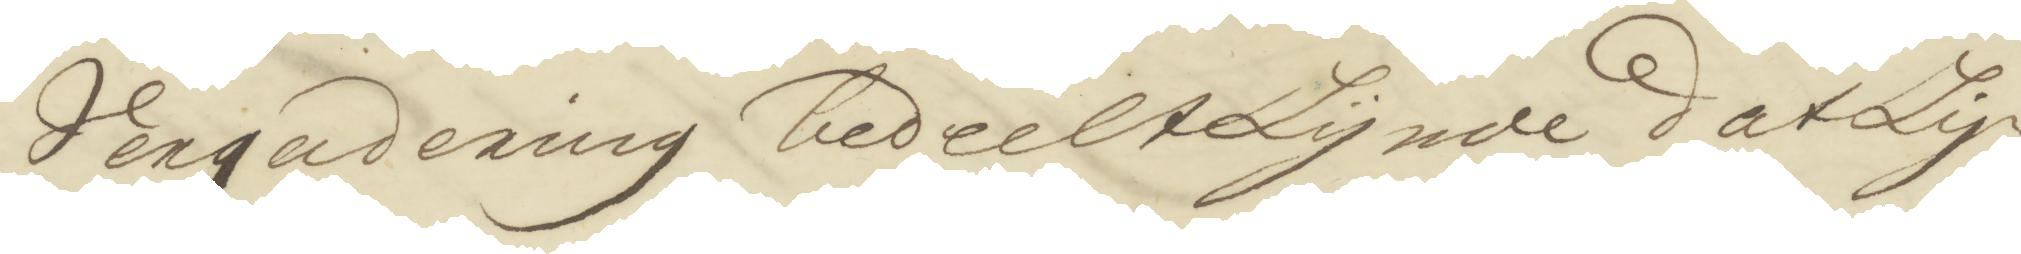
Vergadering bedeelt zijnde dat zijn
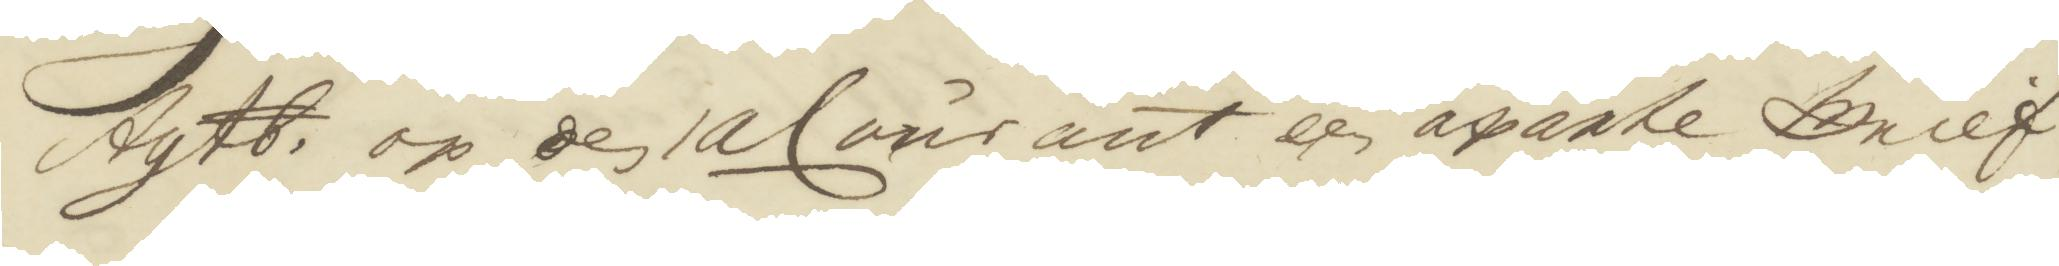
Agtb: op de acourant een aparte Brief
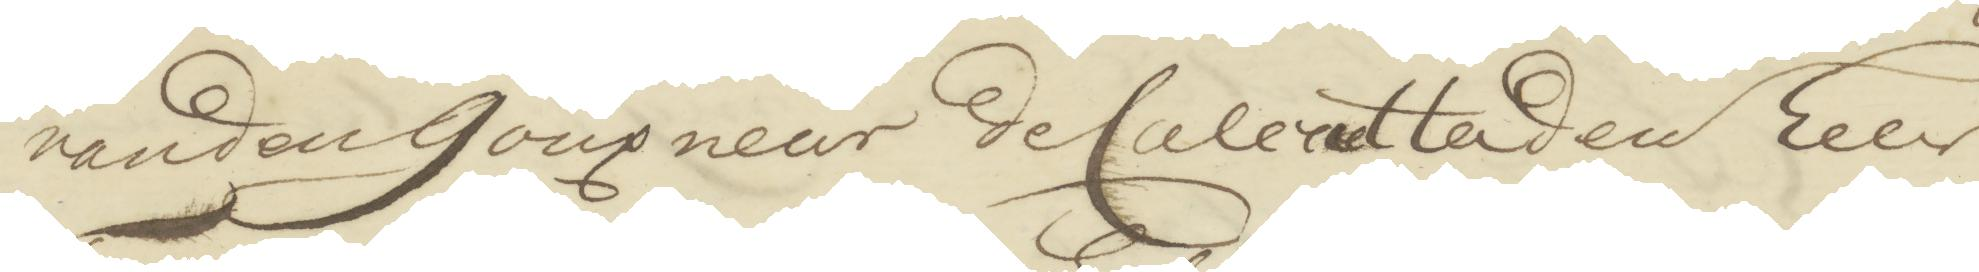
van den Gouvneur de Calcatta den heer
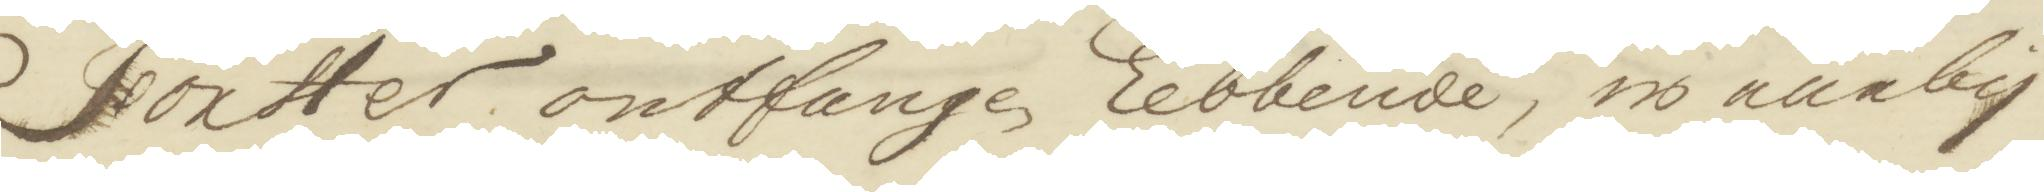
Forster ontfangen hebbende, waarbij
